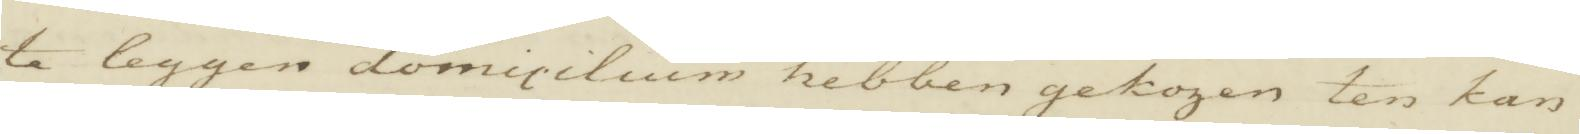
te leggen domicilium hebben gekozen ten kan
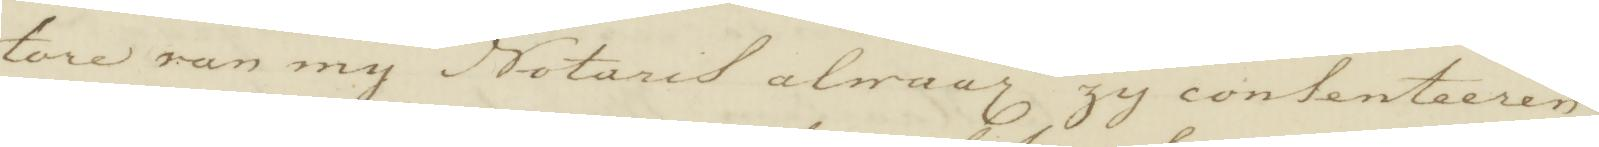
tore van my Notaris alwaar zy consenteeren
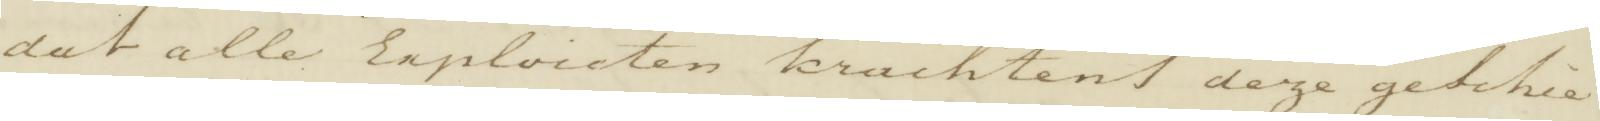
dat alle Exploicten krachtens deze geschie
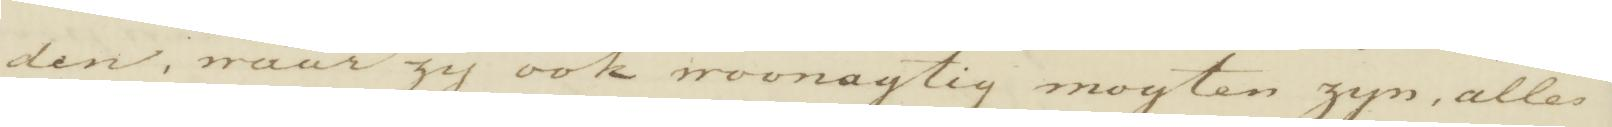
den, waar zy ook woonagtig mogten zyn, alles
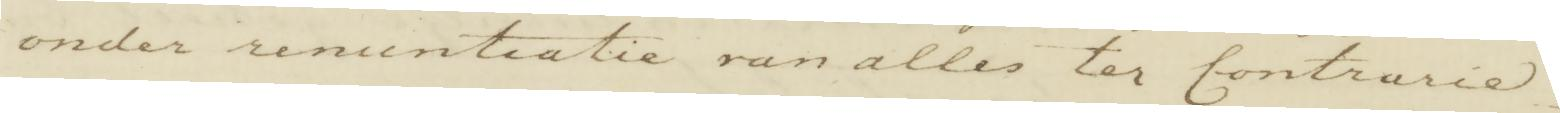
onder renuntiatie van alles ter Contrarie
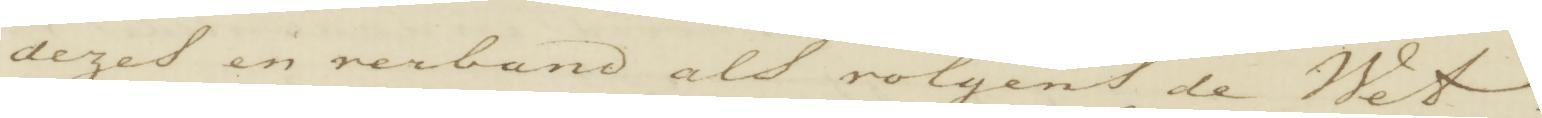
dezes en verband als volgens de Wet
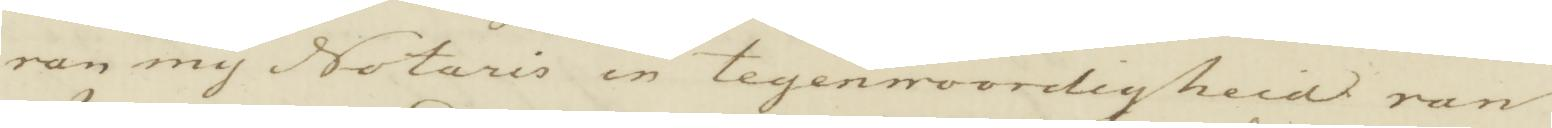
van my Notaris in tegenwoordigheid van
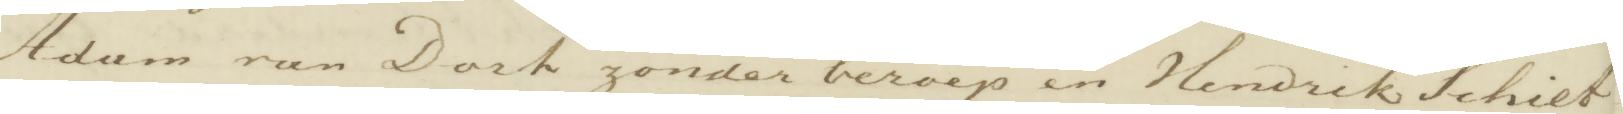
Adam van Dort zonder beroep en Hendrik Schilt
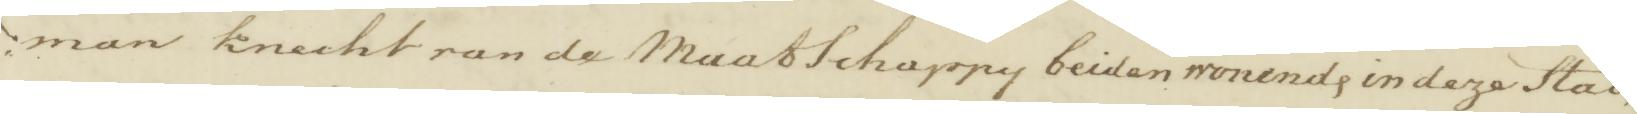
„man knecht van de Maatschappy beiden wonende in deze Stad,
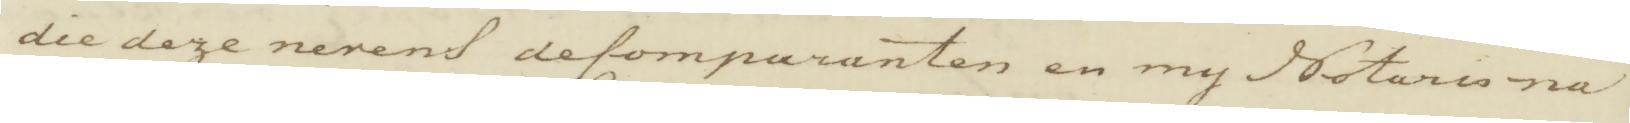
die deze nevens de Comparanten en my Notaris na
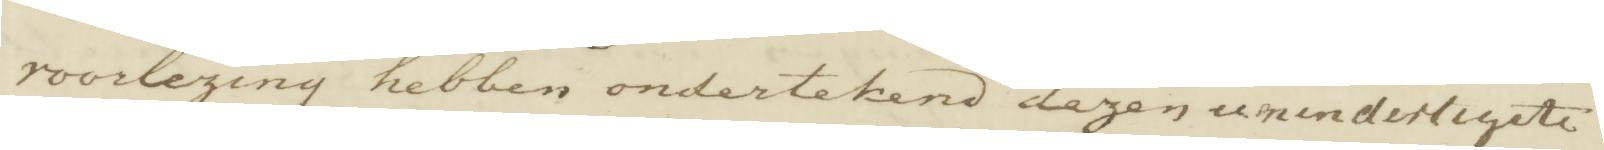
voorlezing hebben ondertekend dezen een en dertigste
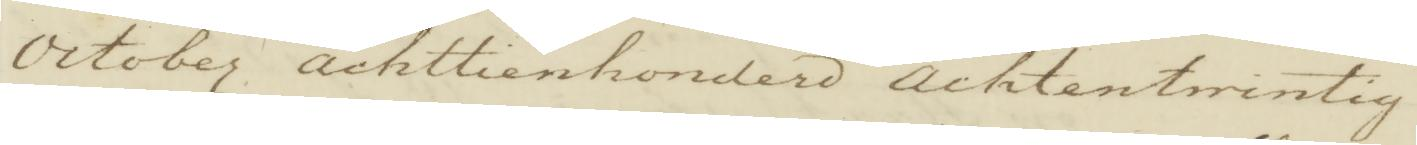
October achttien honderd acht en twintig
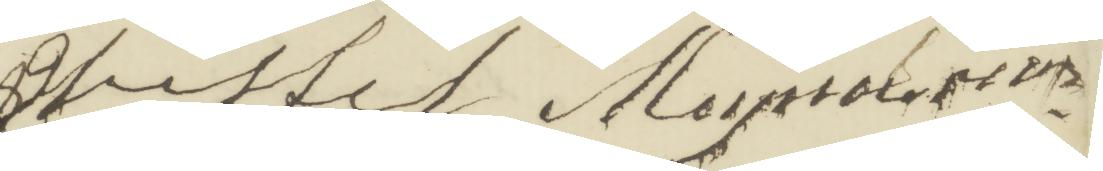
Wessel Meyndering
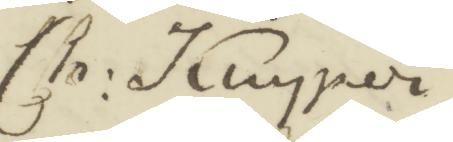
Ch: Kuyper
